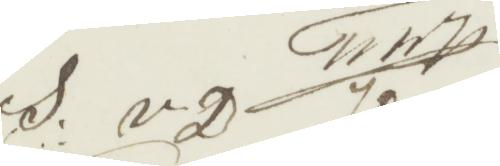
S. VD
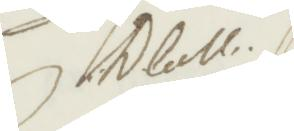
I.D le M.
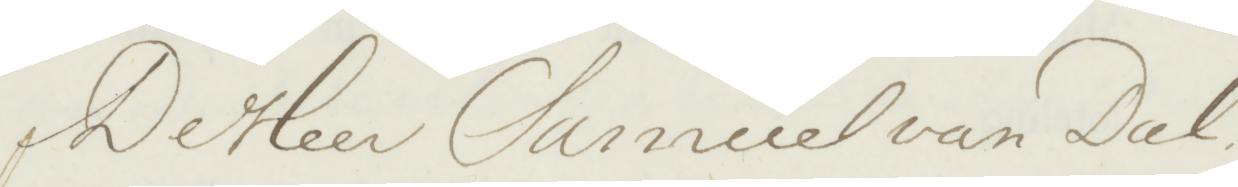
De Heer Samuel van Dal,
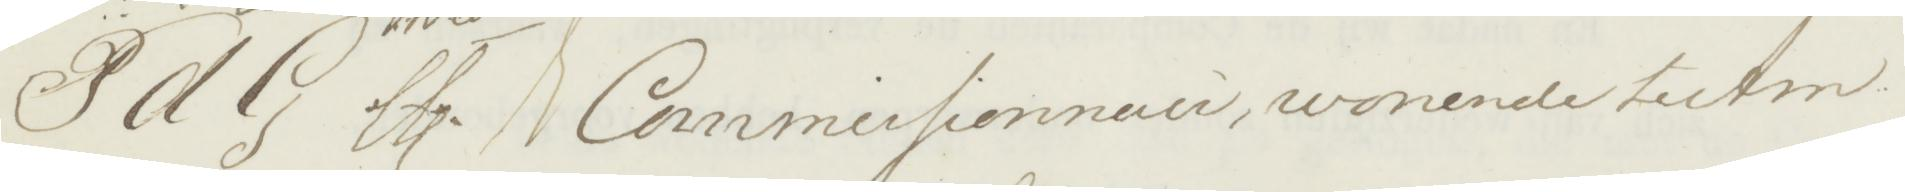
P d G CG. Commissionnair, wonende te Am„
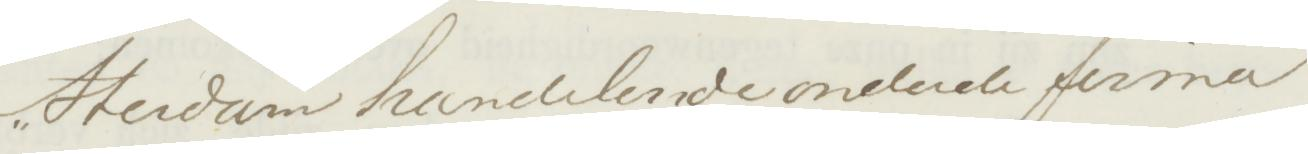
„sterdam van handelende onderde firma
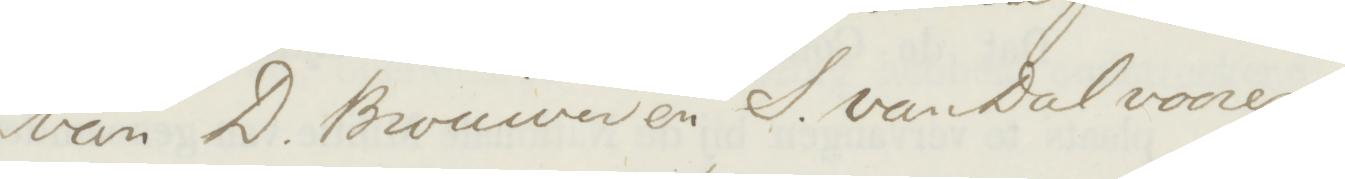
van D. Brouwer en J. van Dal vooren
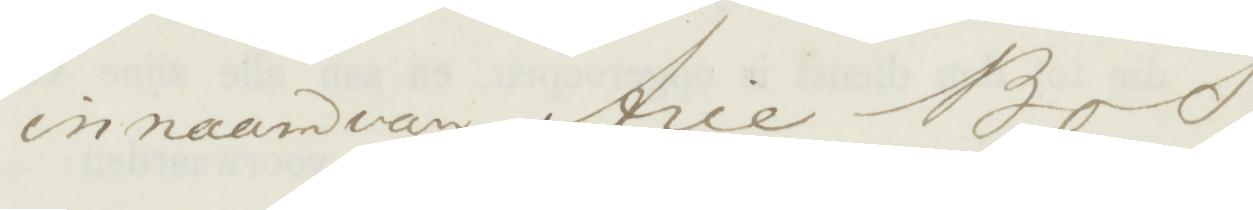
in naam van Arie Bos
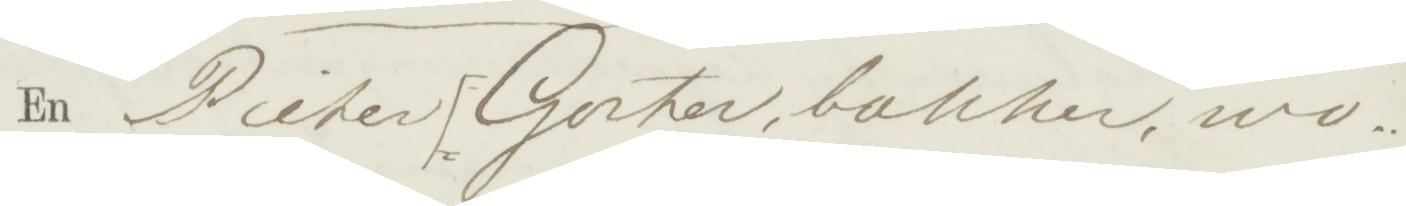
Pieter ¶ Gorter, bakker, wo„
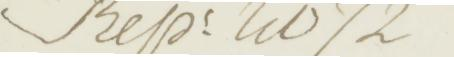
Rep: 4072
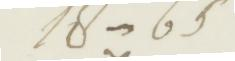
18 6/7 65
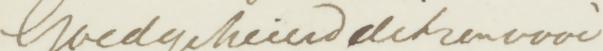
Goedgekeurd ditrenvooi
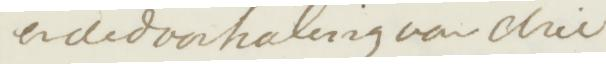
endedoorhaling van drie
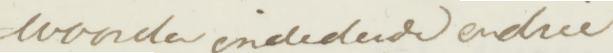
woorde indederde endrie
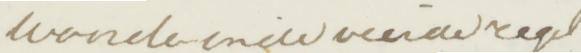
woordeninde vierde regel
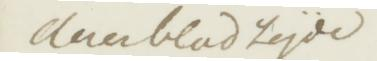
dezerblad zijde
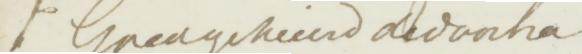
¶ Goedgekeurd dedoorha
